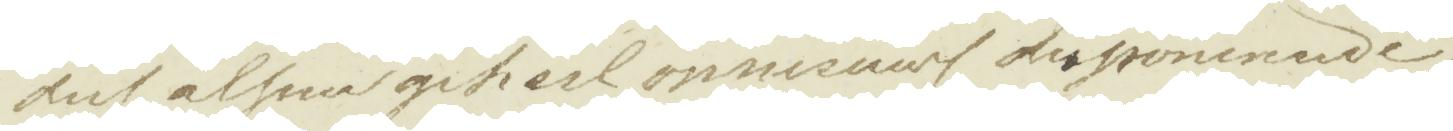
dus alsnu geheel opnieuws disponerende,
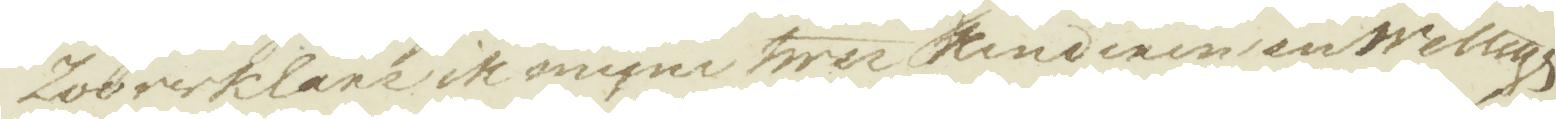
zoo verklare ik myne twee kinderen en wettigen
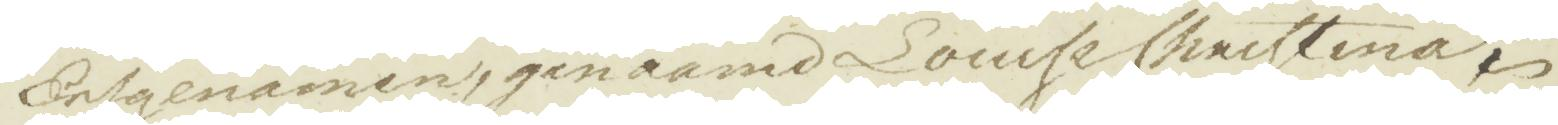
Erfgenamen, genaamd Louise Christina,
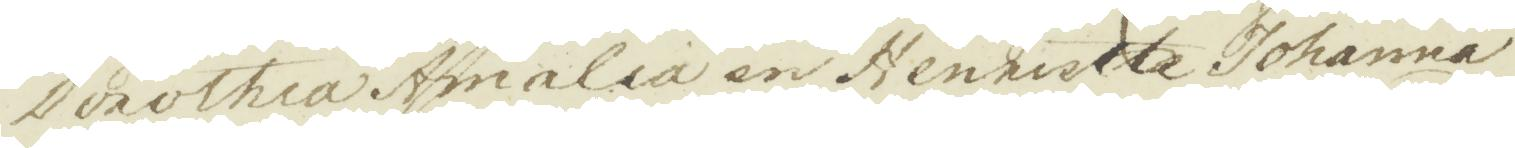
Dorothia Amalia en Henriette Johanna
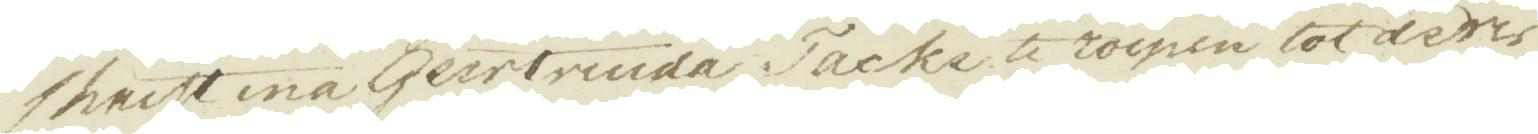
Christina Geertruida Tacke te roepen tot de ver
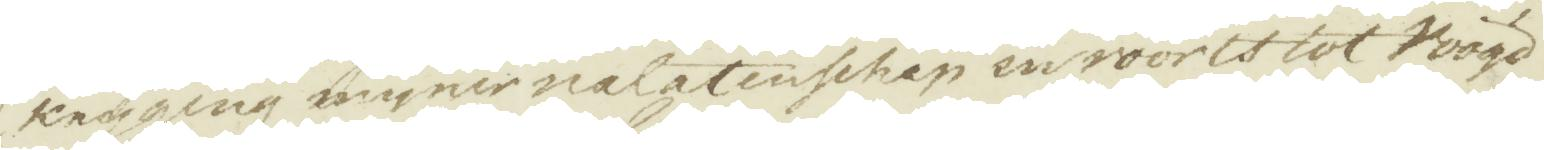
„kryging myner nalatenschap en voorts tot Voogd
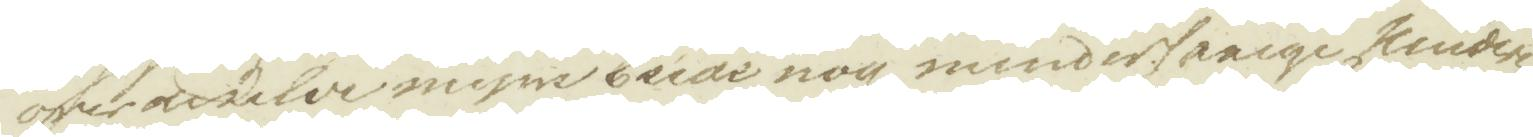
over dezelve myne beide nog minderjarige kinderen
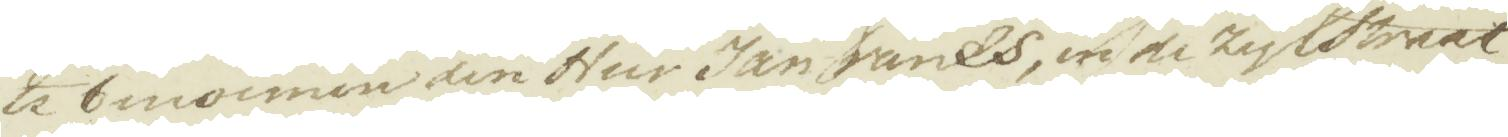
te benoemen den Heer Jan van Es, in de zylstraat
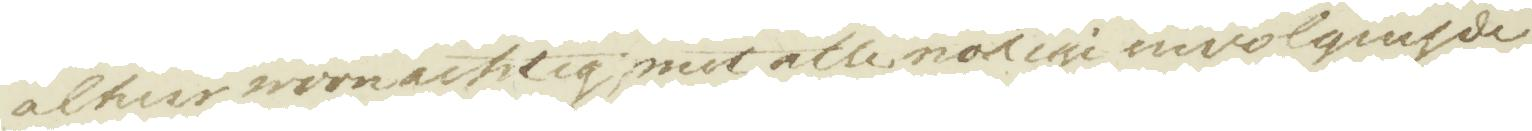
alhier woonachtig, met alle nodige involgengs de
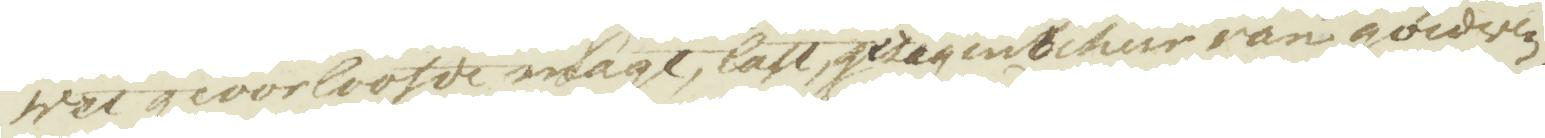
wet geoorloofde magt, last, gezag en beheer van goederen
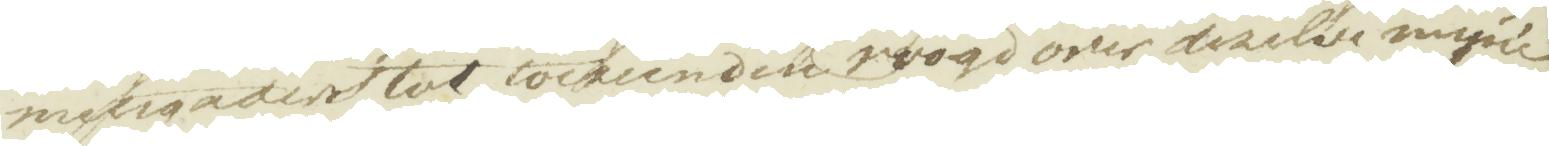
mitsgaders tot toezienden voogd over dezelve myne
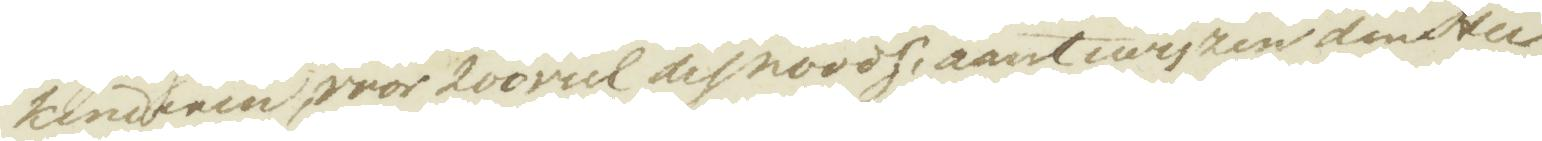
kinderen, voor zoo veel desnoods, aantewyzen den Heer
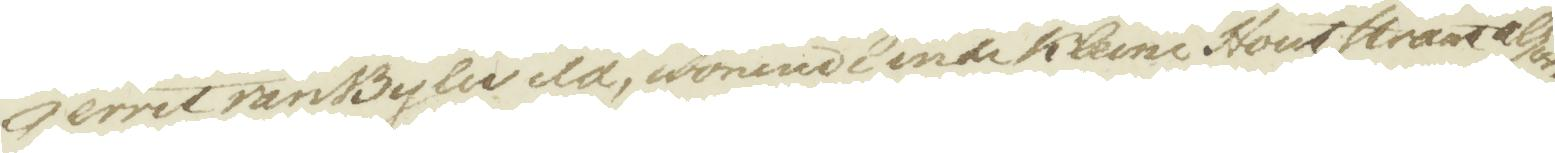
Gerrit van Byleseld, wonende in de Kleine Houtstraat alhier.
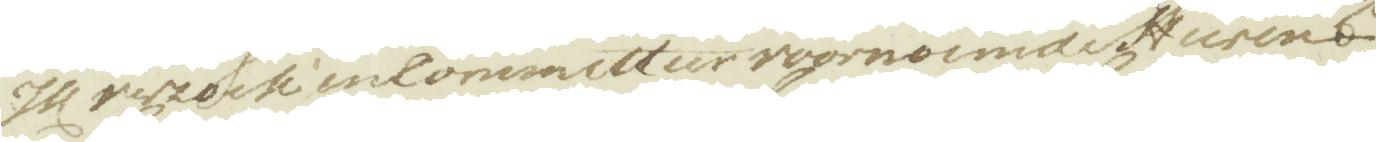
Jk verzoek en Committeer voornoemde Heeren
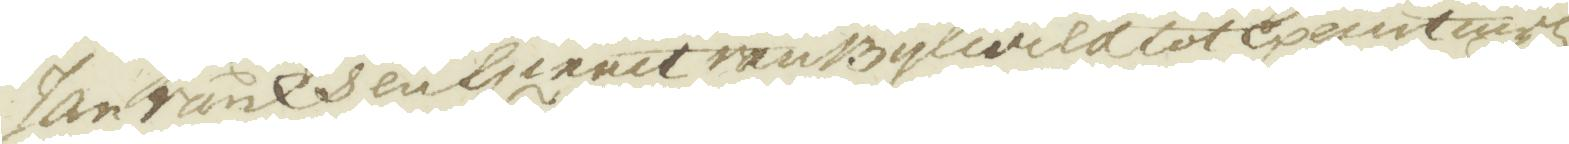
Jan van Es en Gerrit van Byleveld tot Executeuren
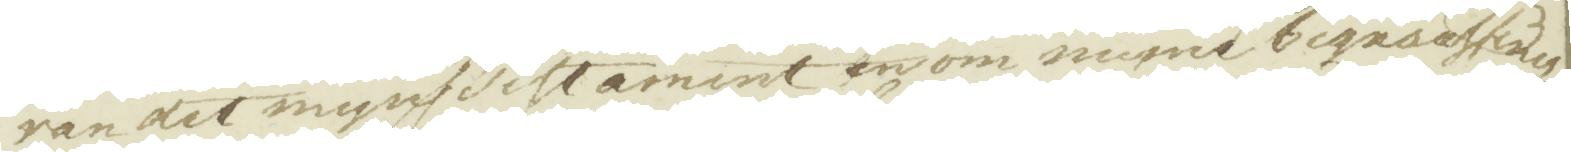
van dit myn Testament en om myne begraaffenis
